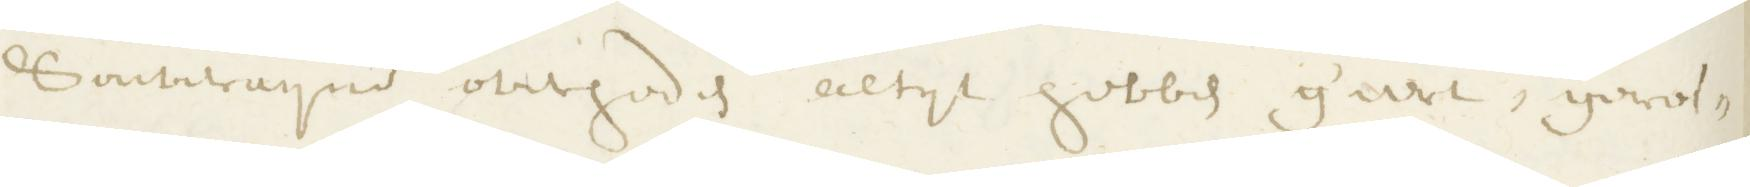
souvereyne overheden altyt hebben g'eert, geres„
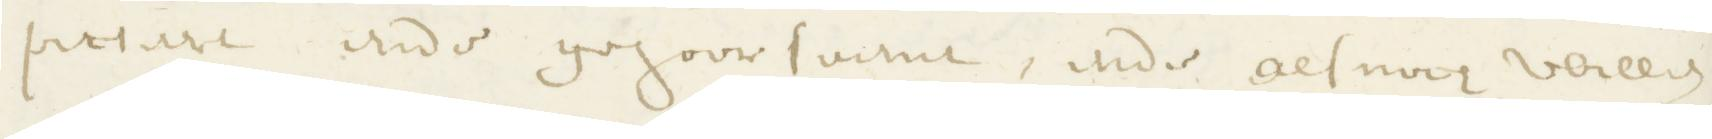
pecteert ende gehoorsaemt, ende alsnoch willen
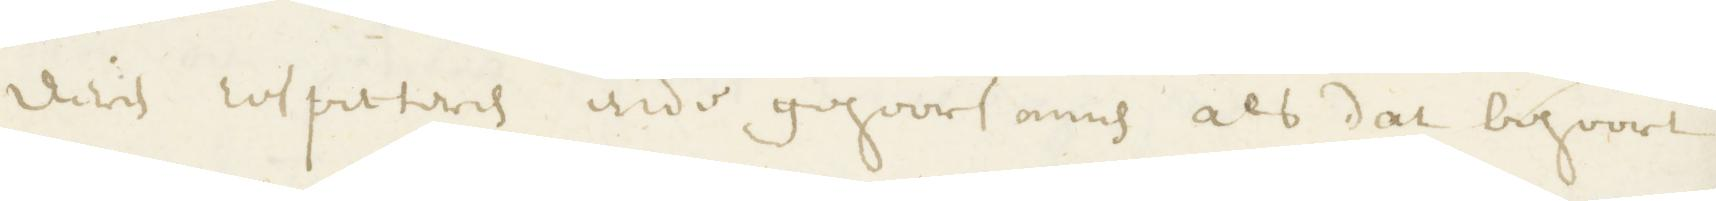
eeren respecteren ende gehoorsamen als dat behoort
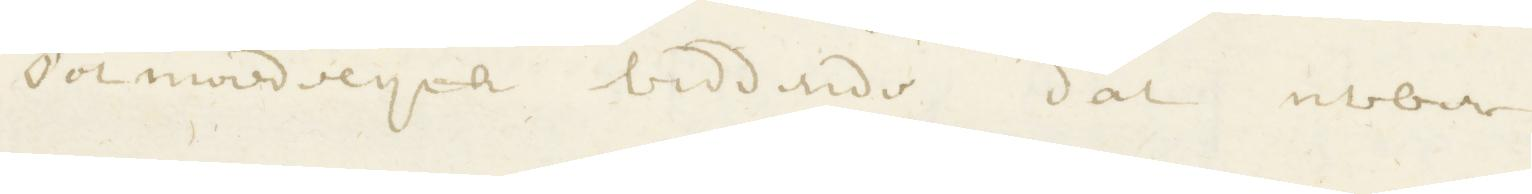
ootmoedelyck biddende dat uwer
